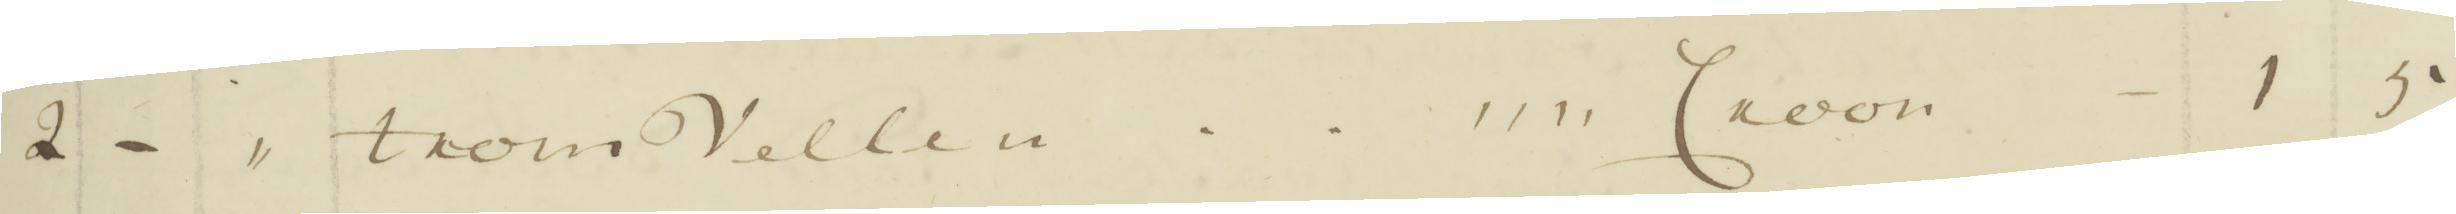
2 — „ trom Vellen . . „ „ Croon — 1 5
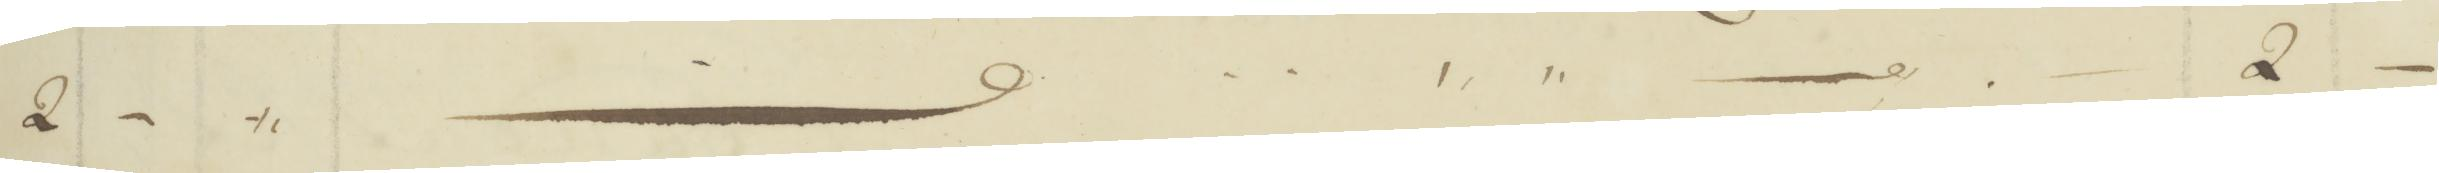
2 — „ _o . . „ „ _o . — 2 —
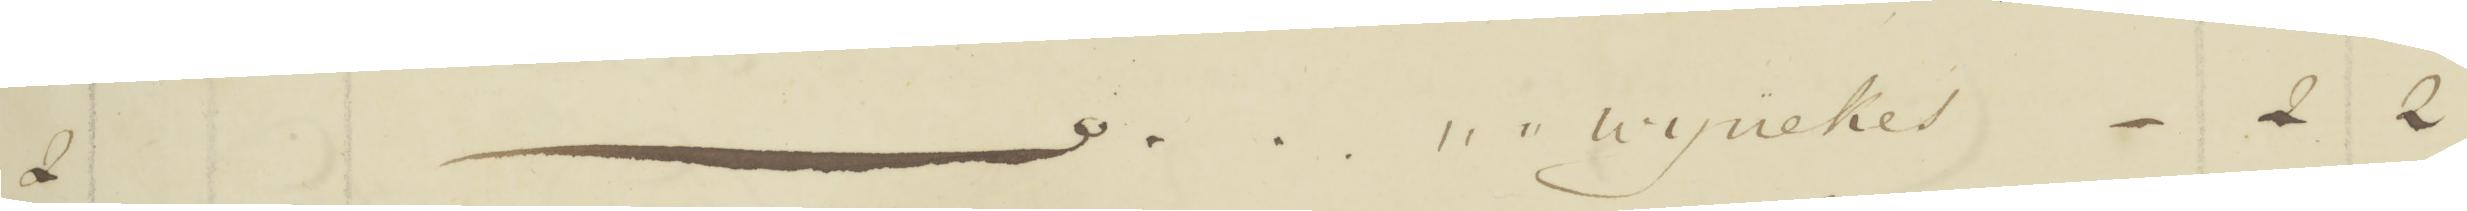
2 _o . . . „ „ wijnekes — 2 2
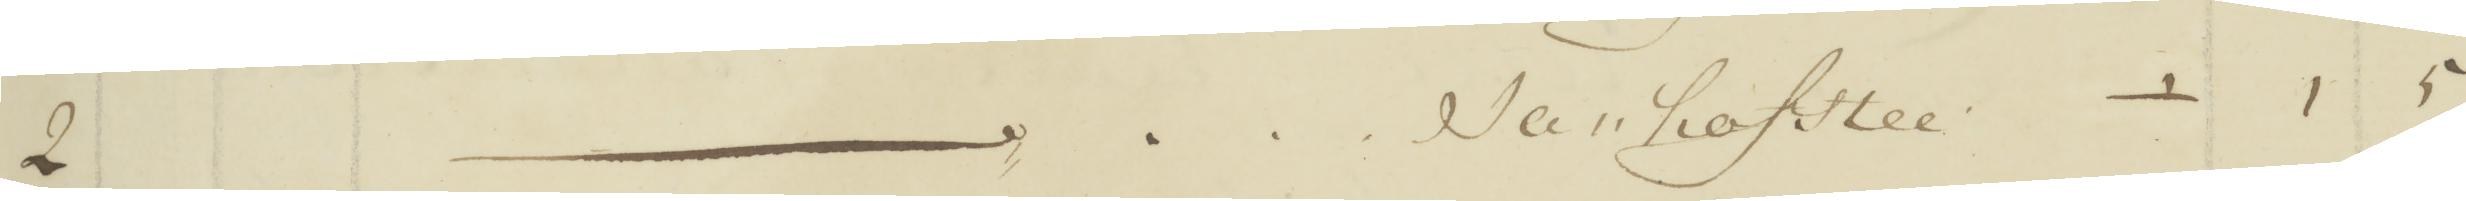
2 _„o . . . Ian hofstee — 1 5
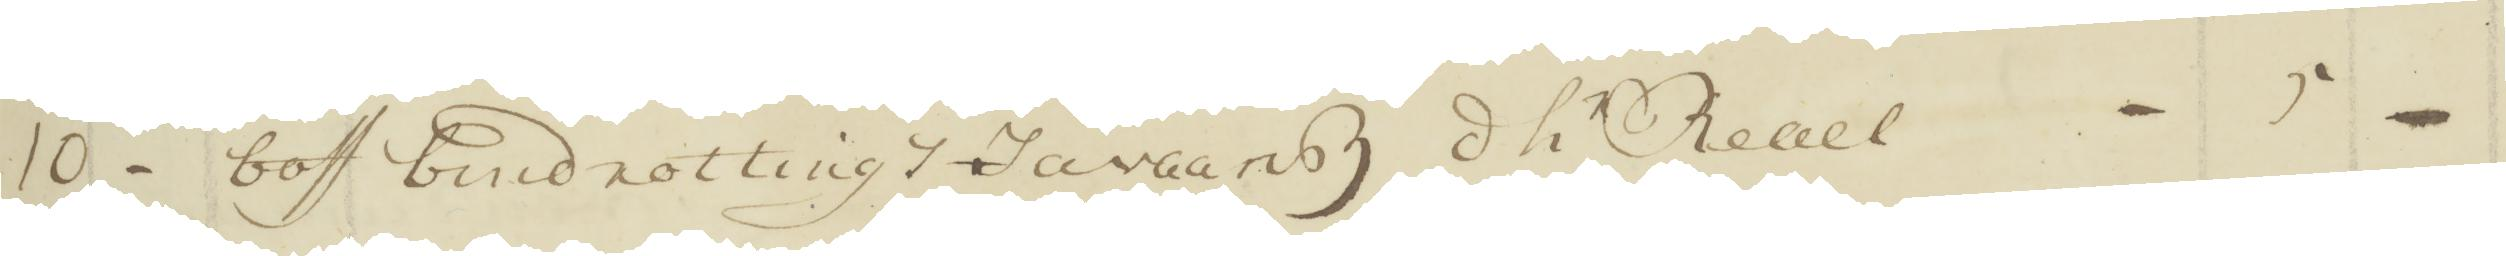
10 – boss bindrottings Iavaans dhr Reael — 5 —
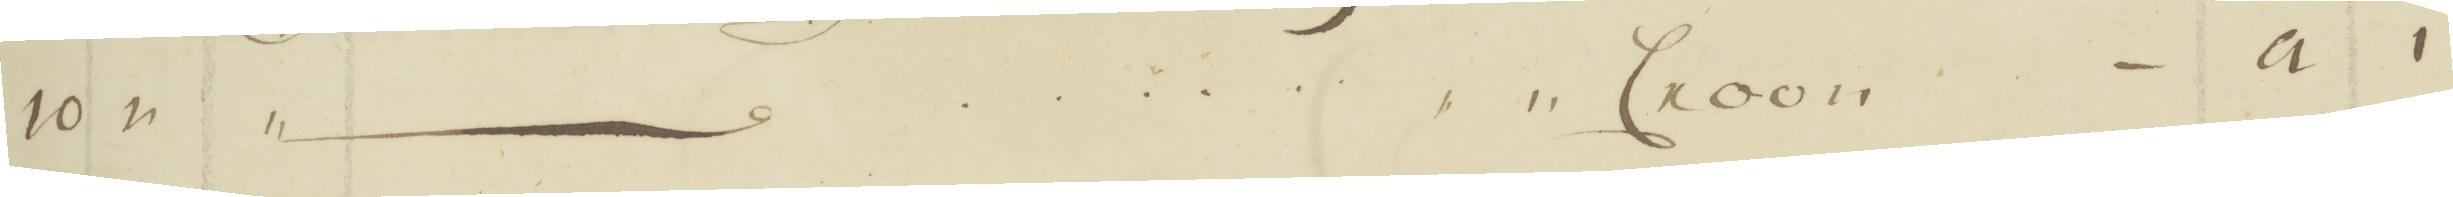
10 „ _o . . . . . . „ „ Croon — 4 1
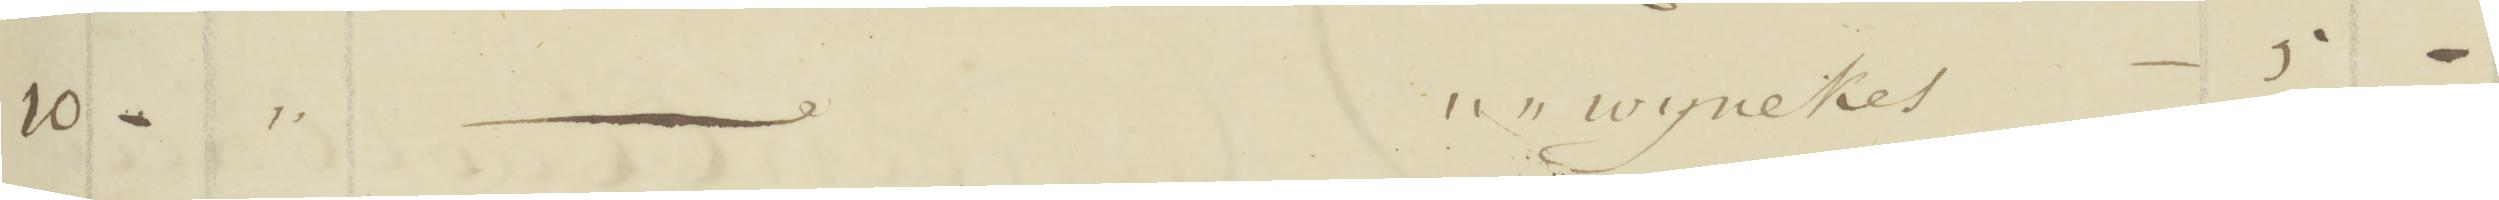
10 – „ _o „ „ wynekes — 5 —
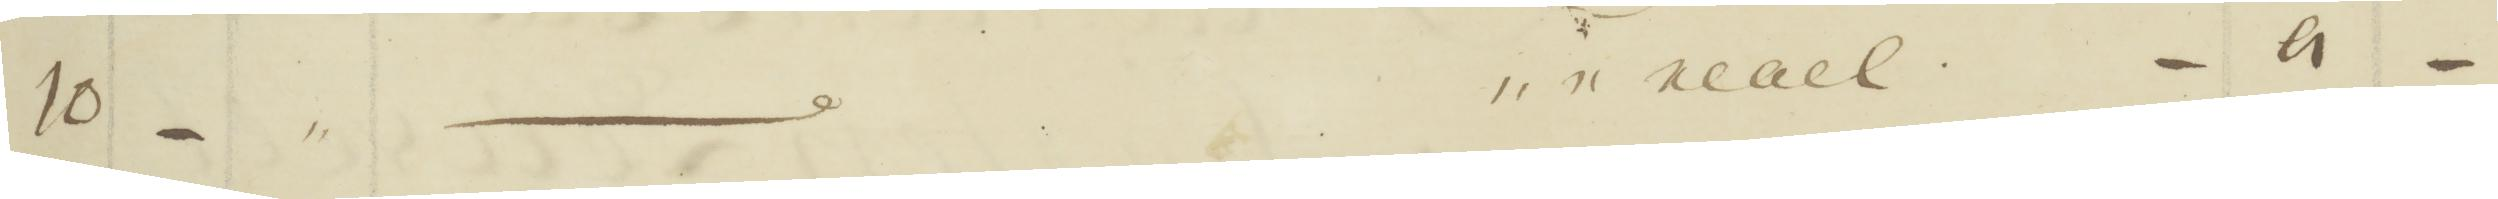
10 — _o „ „ reael — 4 —
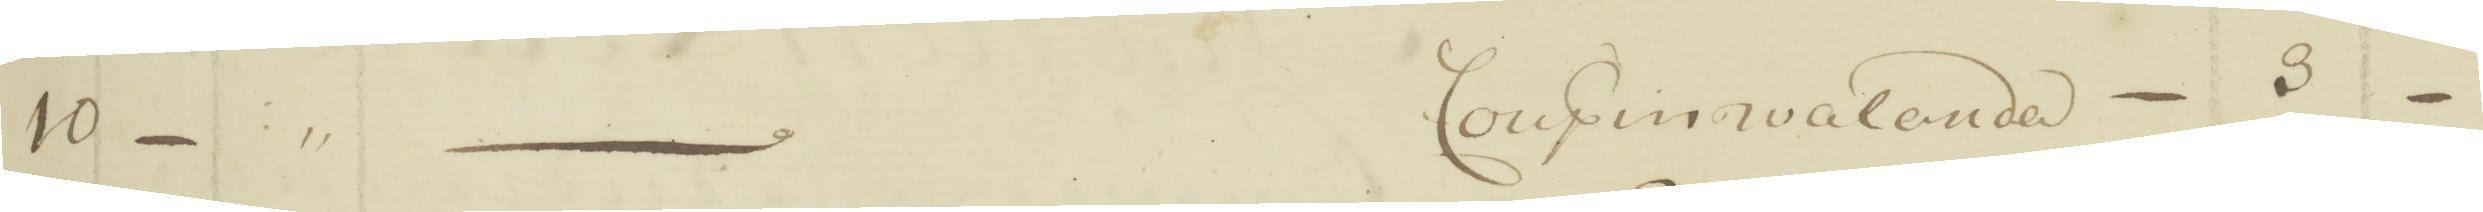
10 — „ _o Coupinwalanda — 3 —
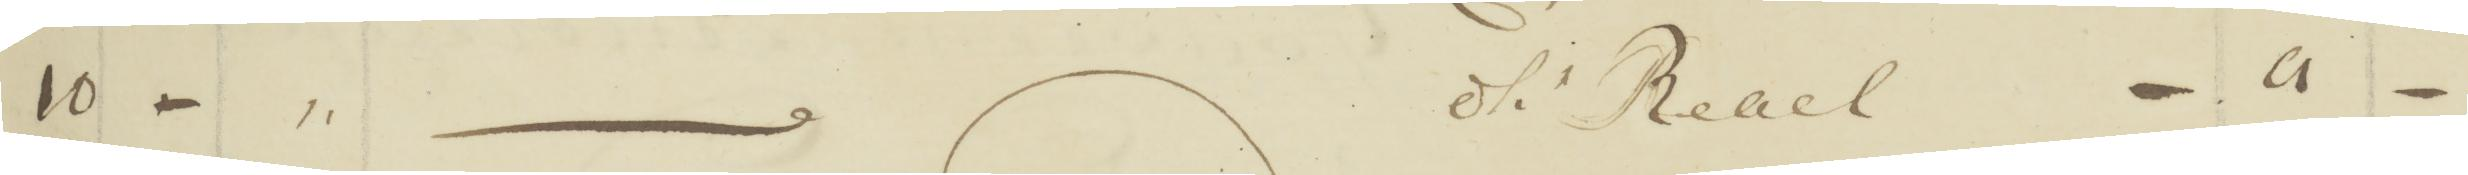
10 — „ _o dhr Reael — 4 —
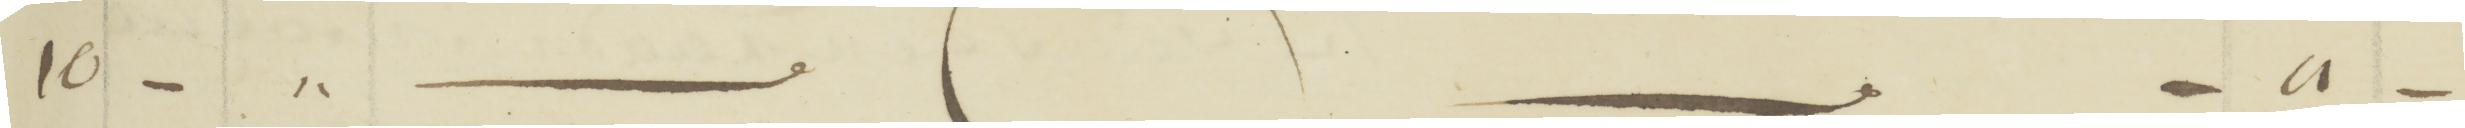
10 — „ _o _o — 4 —
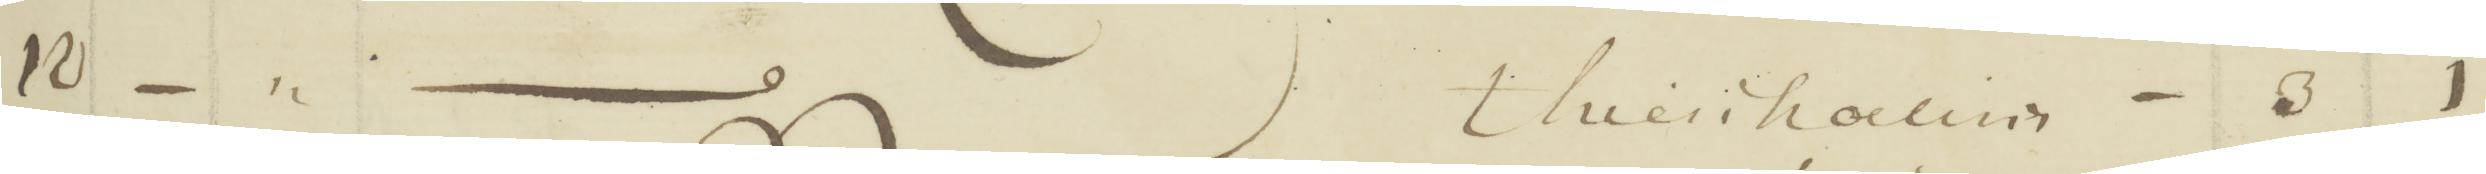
18 — „ _o thien hoelins — 3 1
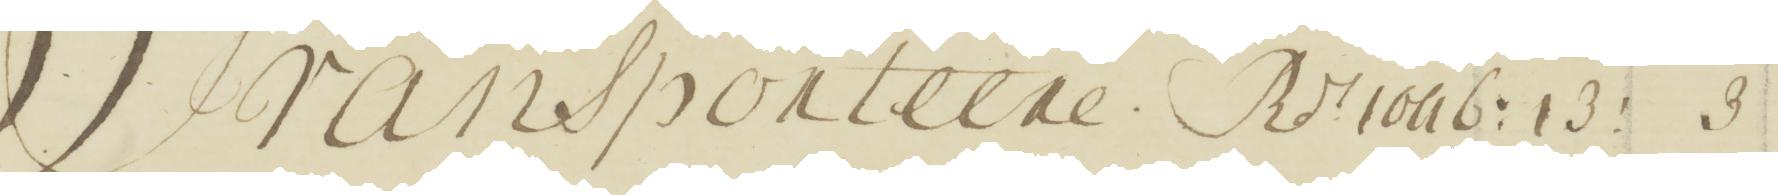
Transporteere. Rd.s 1046: 13: 3
